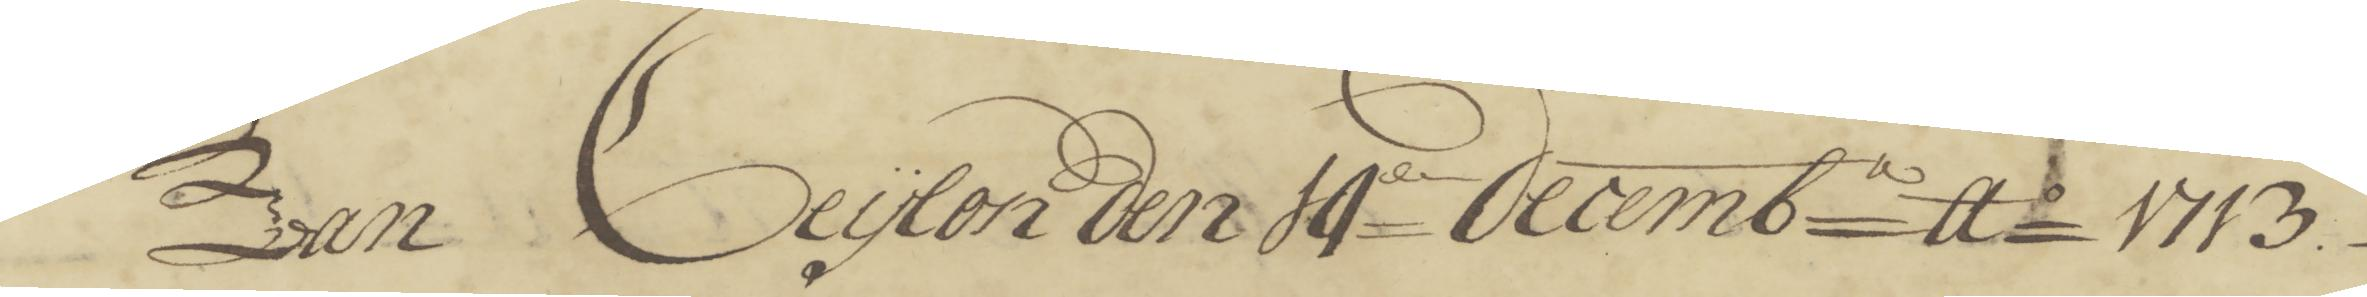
van Ceijlon den 14=en decemb=r A=o 1713.
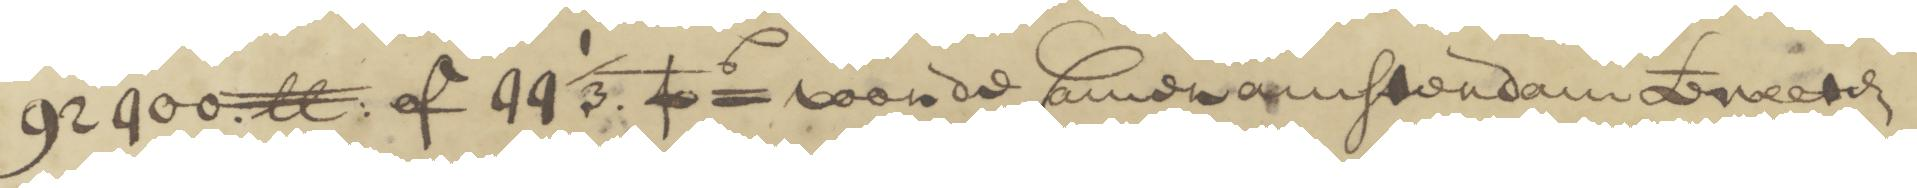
92400. lb: of 44 1/3. p=s voor de Camer amsterdam teweeten
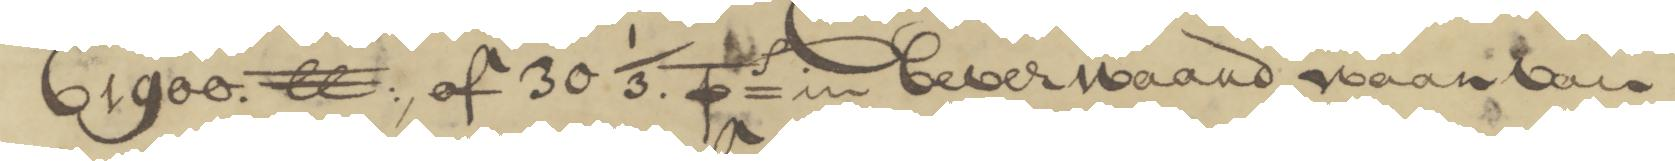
61900. lb:, of 30 1/3. p=s in beverwaard, waar van
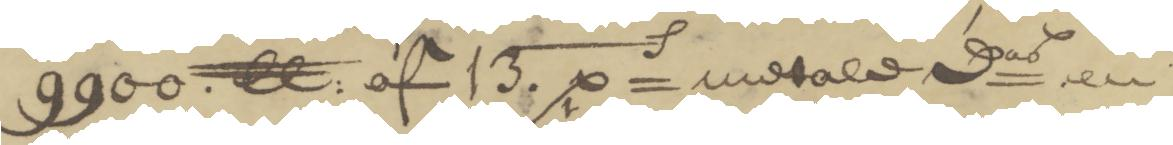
9900. lb: of 13. p=s metale D=os en
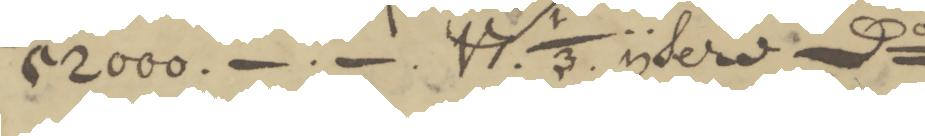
52000. —.—. 17. 1/3. ijsere D=o
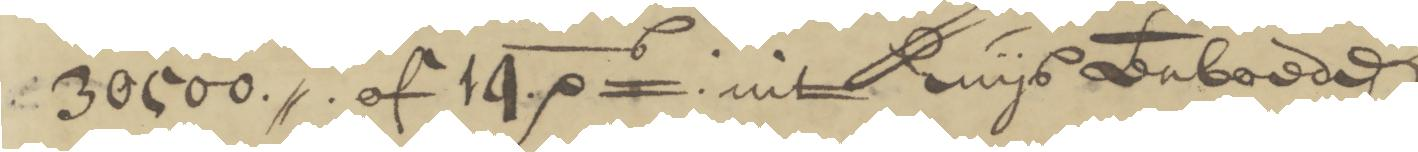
30500.„. of 14. p=s: in't huijs terboede
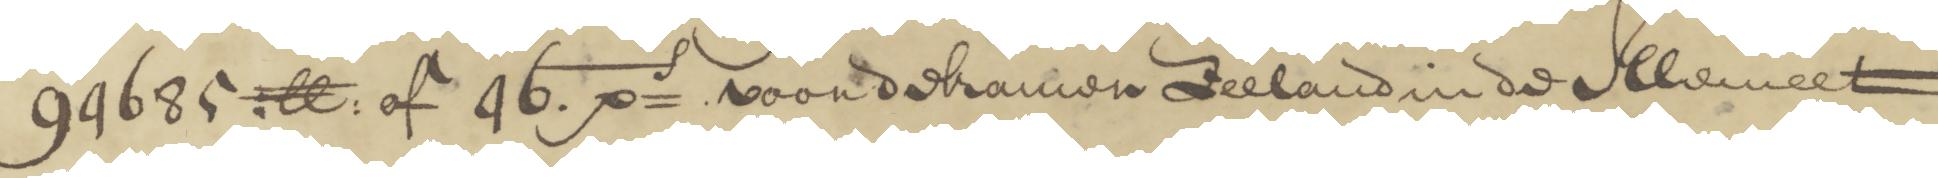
94685: lb: of 46. p=s. voor dekamer zeeland in de Ellemeet
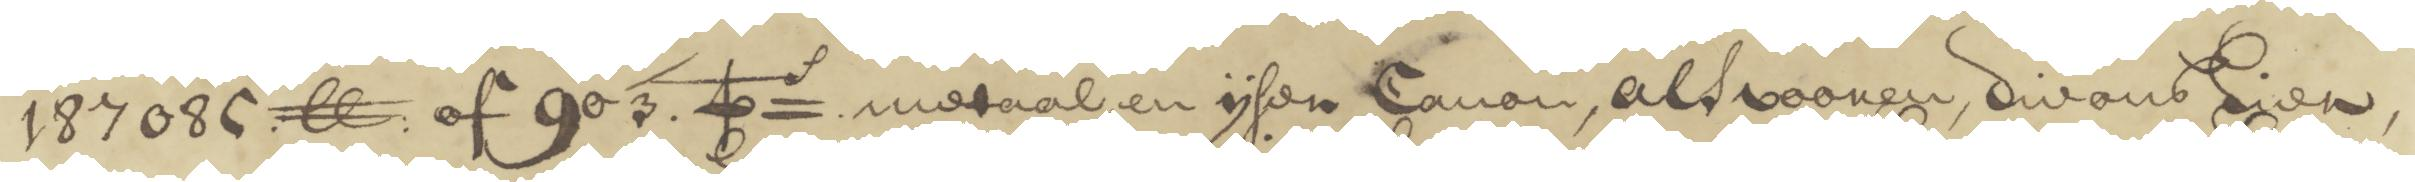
187085: lb: of 90 1/3. p=s. metaal, en ijser Canon, als vooren, die ons hier,
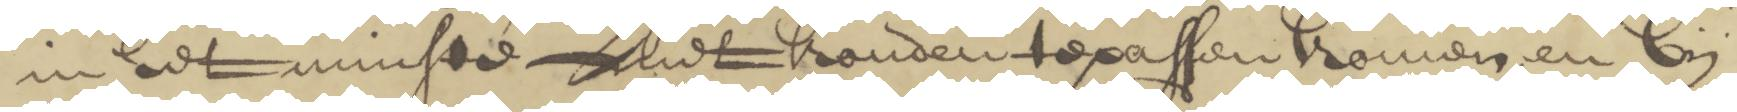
in het minste niet konden te passen komen, en bij
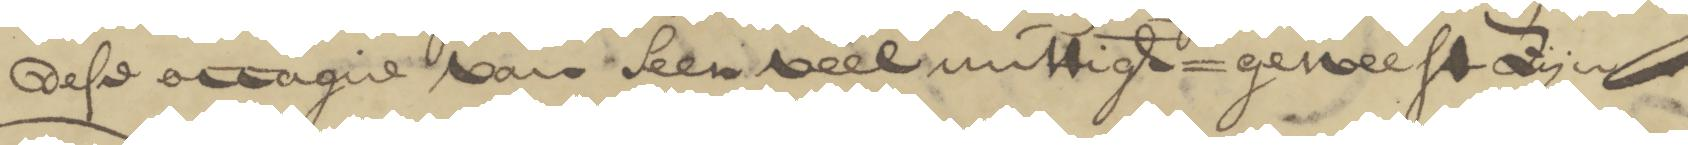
dese occagie van seer veel nuttigh=d geweest zijn
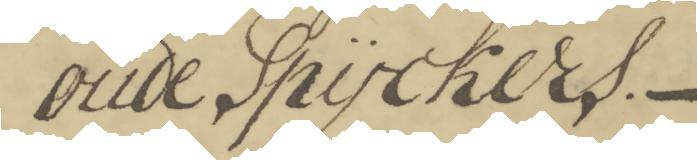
oude spijckers.—
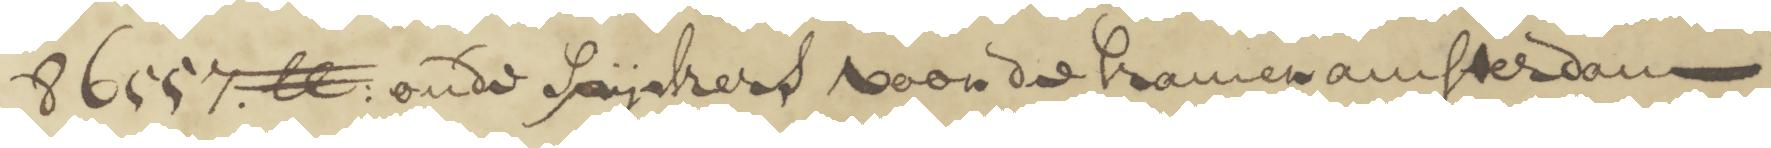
86557: lb: oude spijckers voor de kamer amsterdam
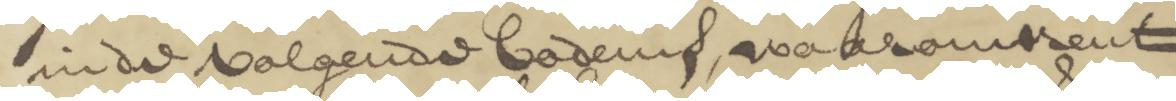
in de volgende bodems, waaromtrent
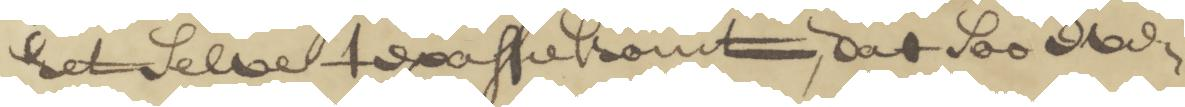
het selve tepasse komt, dat soo Even
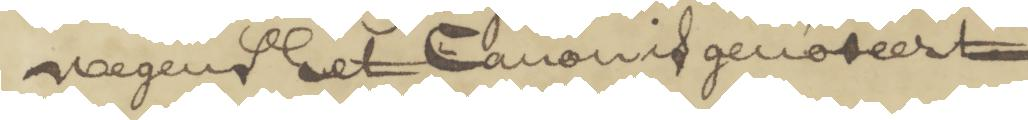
wegens het Canon is genoteert
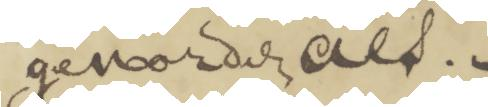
geworden als.—
